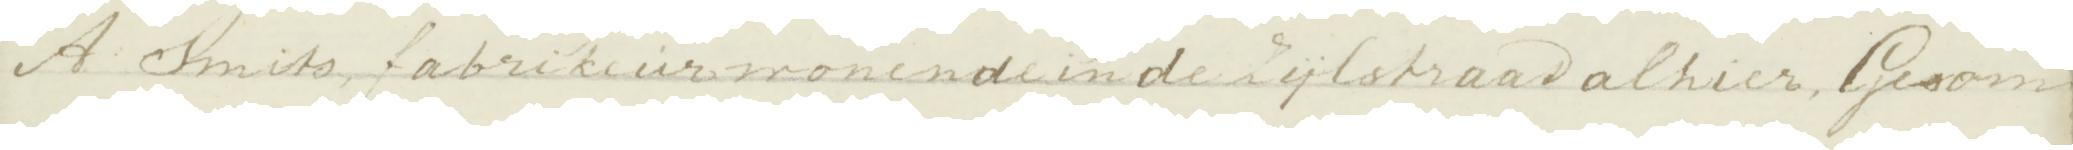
A: Smits fabrikeur wonende in de Zijlstraad alhier, Gesom
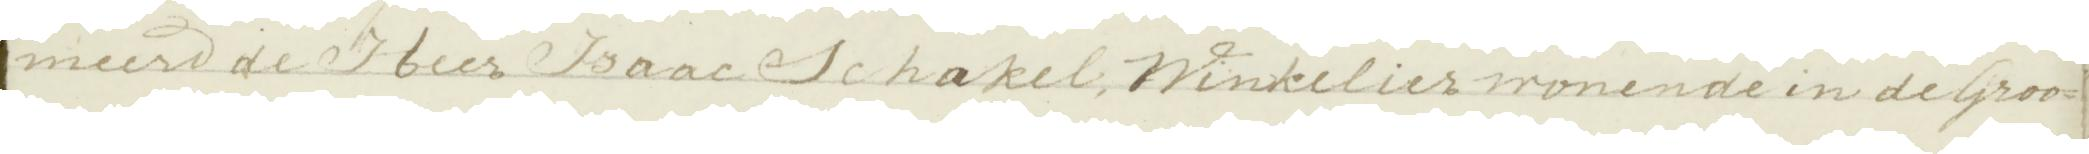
meerd de Heer Isaac Schakel, Winkelier wonende in de Groo=
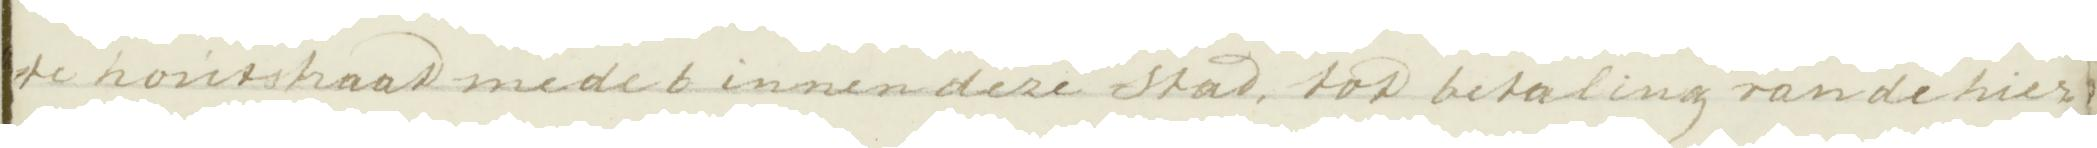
=te houtstraad mede binnen deze stad, tot betaling van de hier
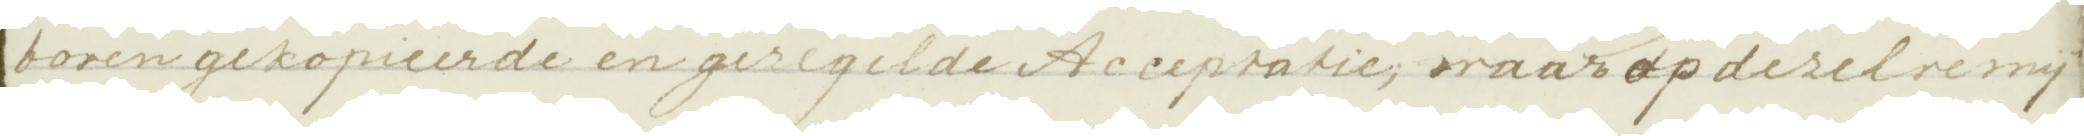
boren gekopieerde en gezegelde Acceptatie, waar op dezelve mij
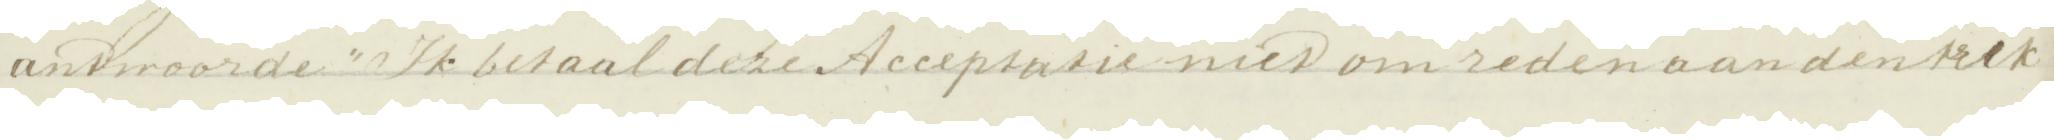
andwoorde "Ik betaal deze Acceptatie niet om reden aan den trek
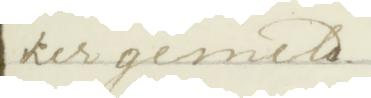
ker gemeld
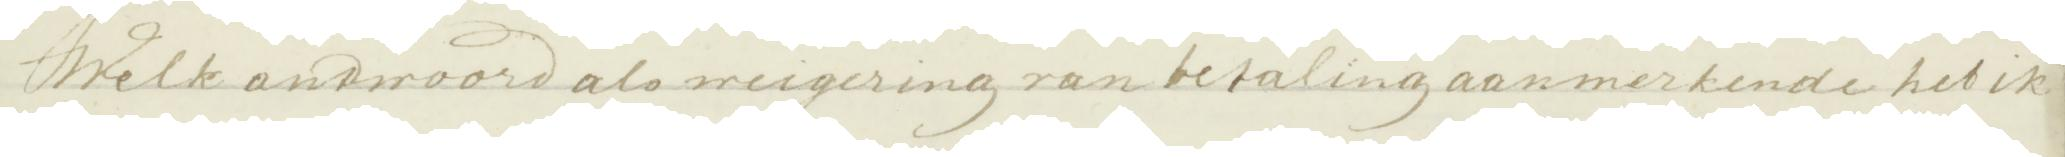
Welk andwoord als weigering van betaling aanmerkende heb ik
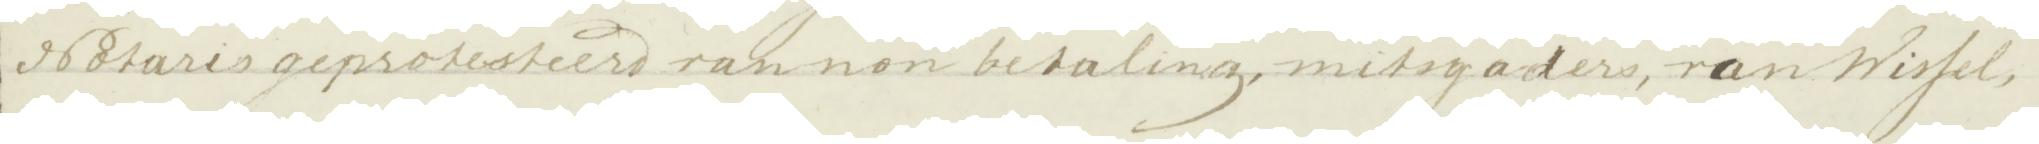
Notaris geprotesteerd van non betaling, mitsgaders, van Wissel,
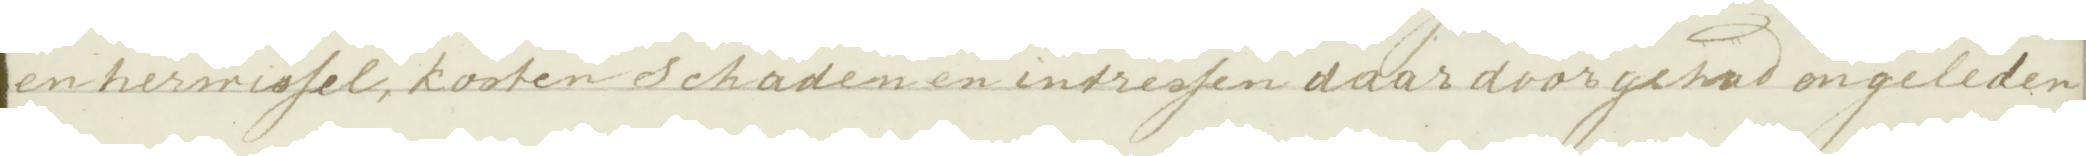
en herwissel, kosten schaden en intressen daar door gehad ongeleden
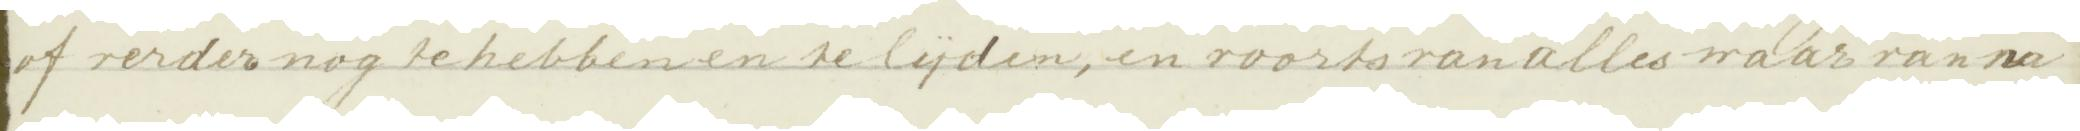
of verder nog te hebben en te lijden, en voorts van alles waar van na
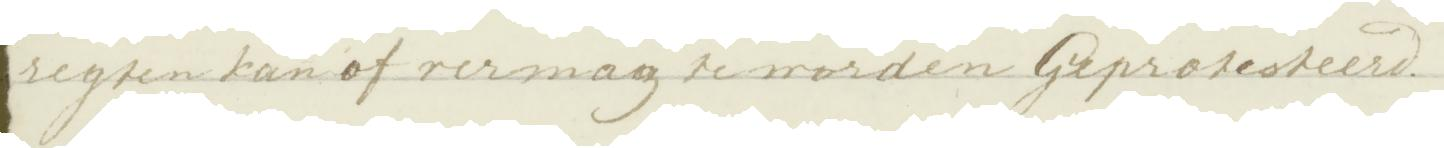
regten kan of vermag te worden Geprotesteerd.
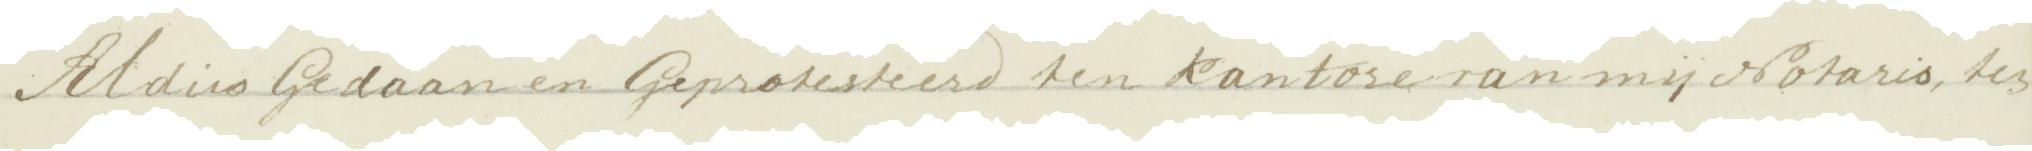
Aldus Gedaan en Geprotesteerd ten kantore van mij Notaris, ten
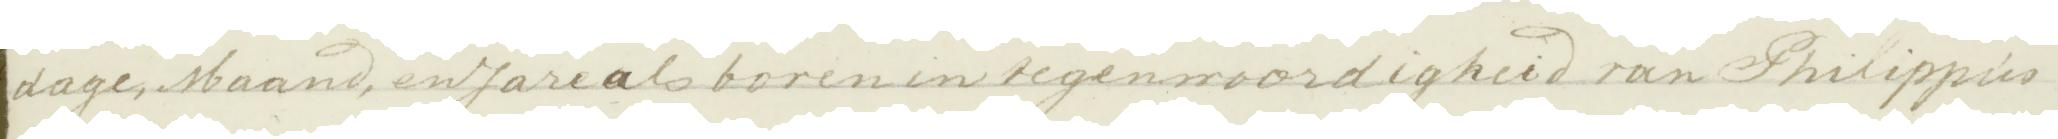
dage, Maand, en Jare als boven in tegenwoordigheid van Philippus
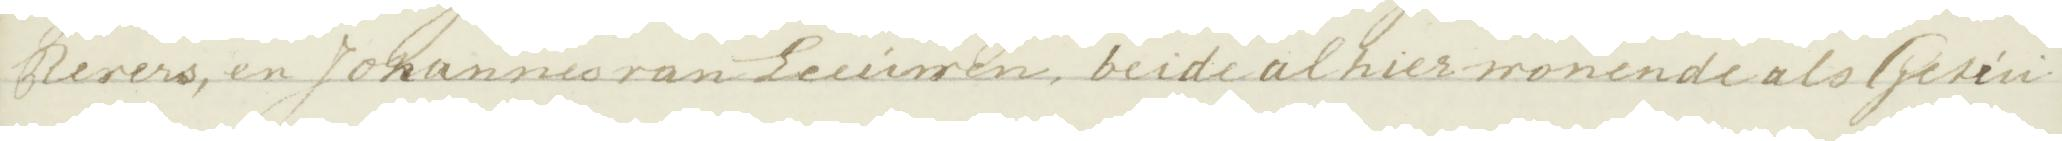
Revers, en Johannes van Leeuwen, beide alhier wonende als Getui
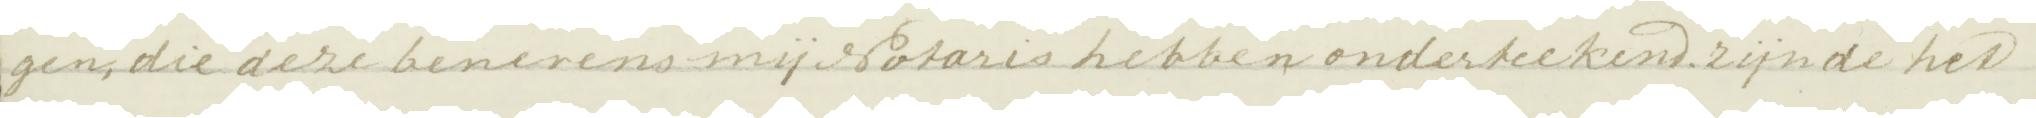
gen, die deze benevens mij Notaris hebben onderteekend zijnde het
